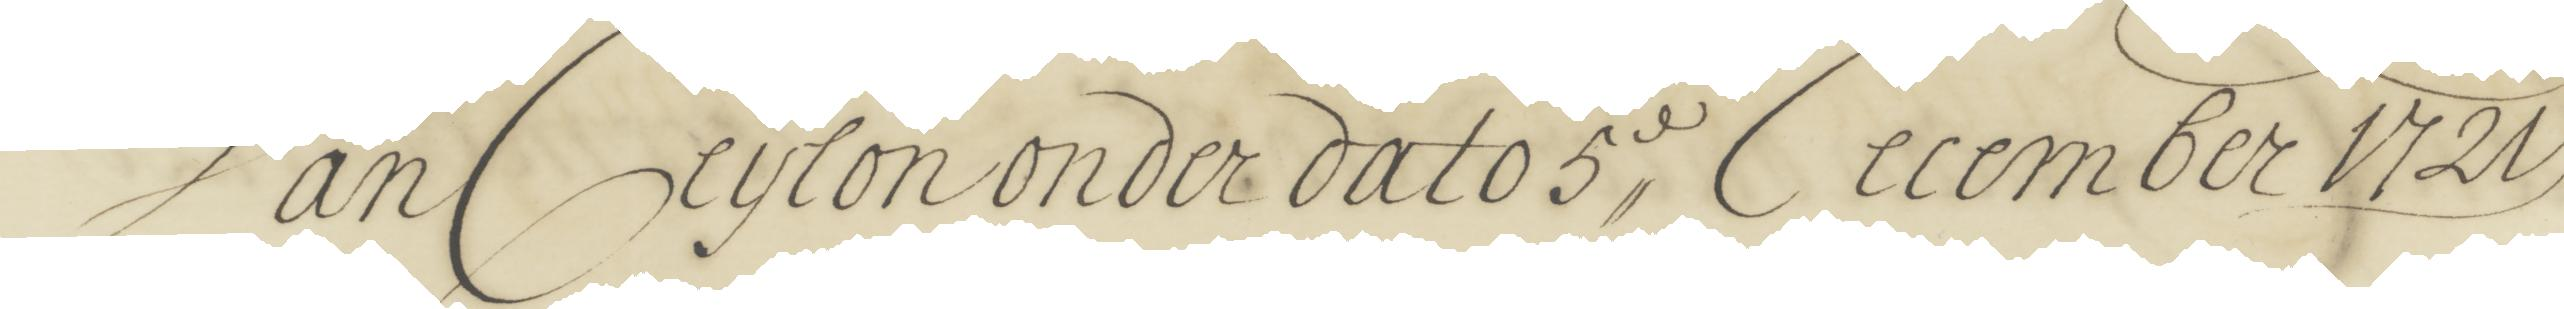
Van Ceylon onder dato 5„e december 1721
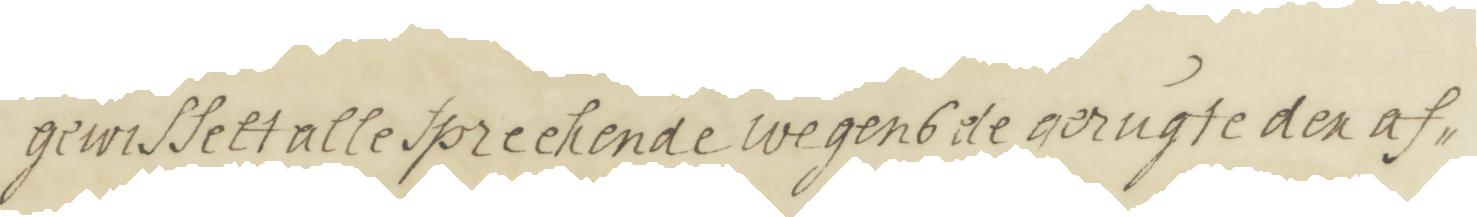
gewisselt alle spreekende wegens de gerugte der af„
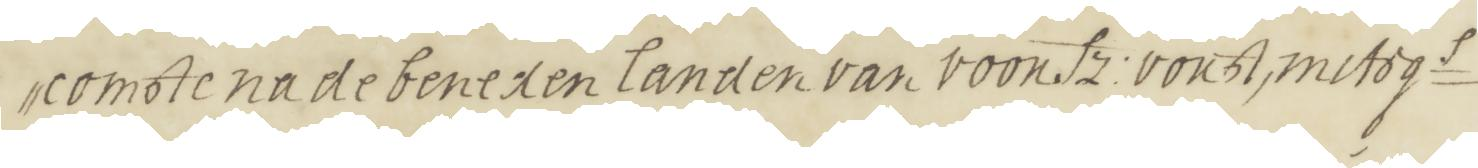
„comste na de beneden landen van voorsz: vorst, mitsg=s
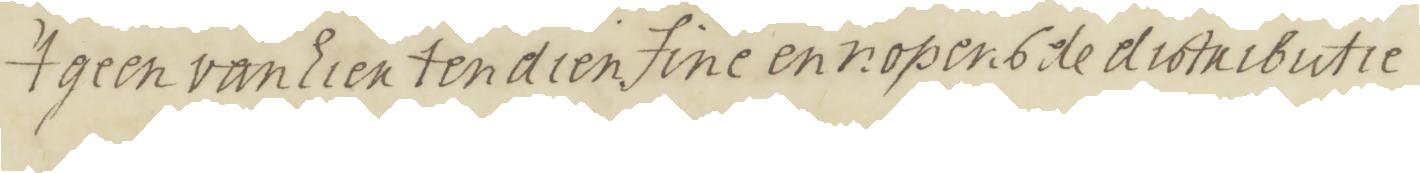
’t geen van hier ten dien fine en nopens de distributie
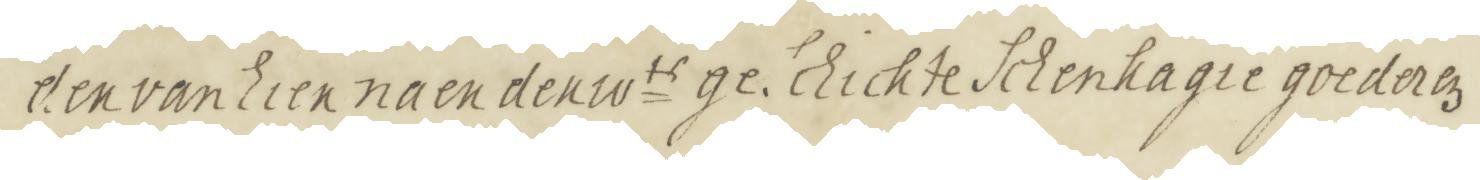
der van hier naer derw=ts geschickte schenkagie goederen
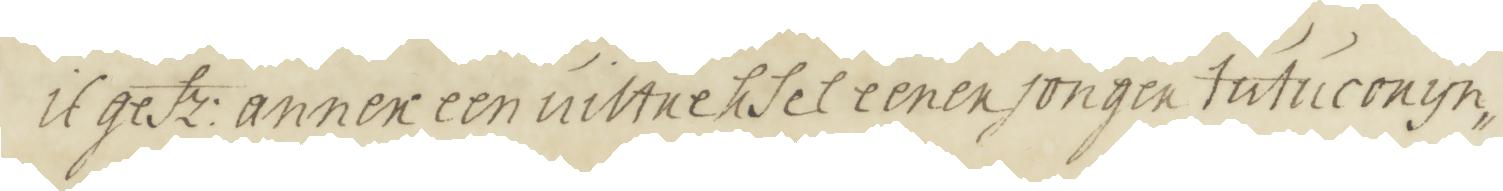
is gesz: annex een uittreksel eener jonger tutucorijn„
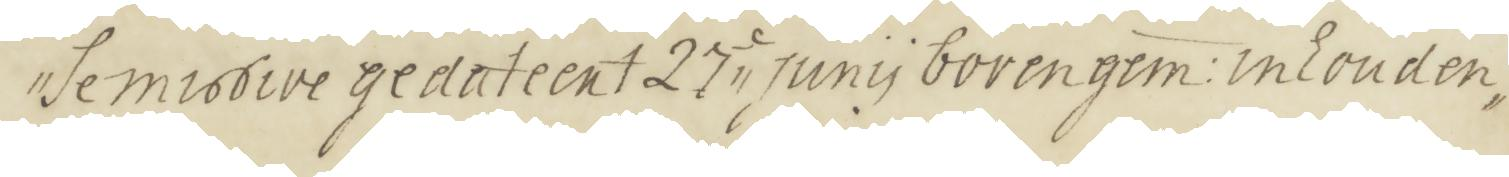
„se missive gedateert 27„e junij boven gem: inhouden„
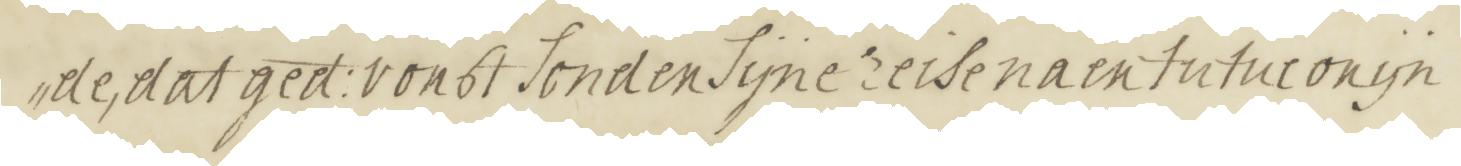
„de, dat ged: vorst sonder sijne reise naer tutucorijn
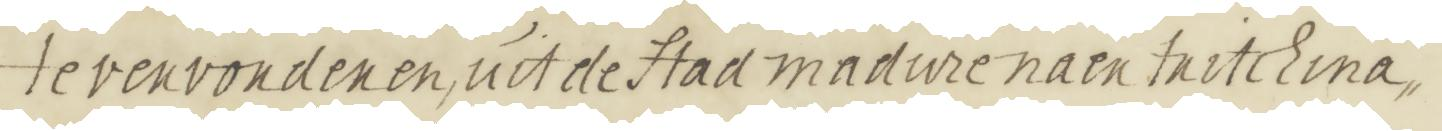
te vervorderen, uit de stad madure naer tritchina„
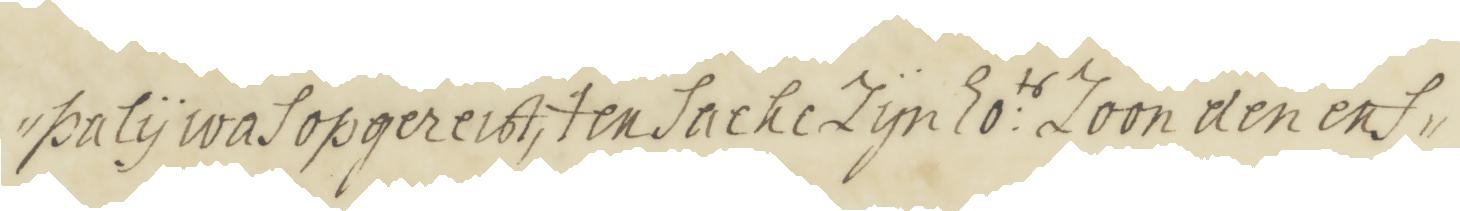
„palij was opgereist, ten saeke zijn ho:ts zoon den erf„
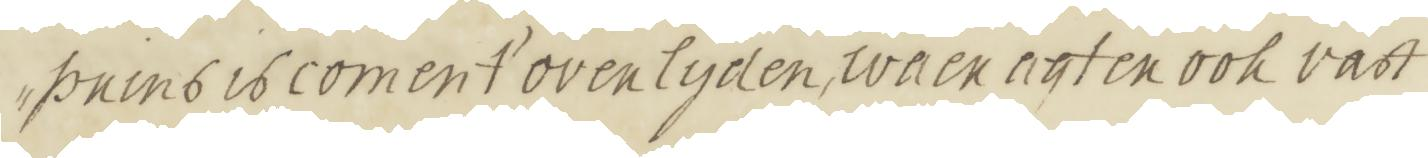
„prins is comen 't overlijden, waer agter ook vast
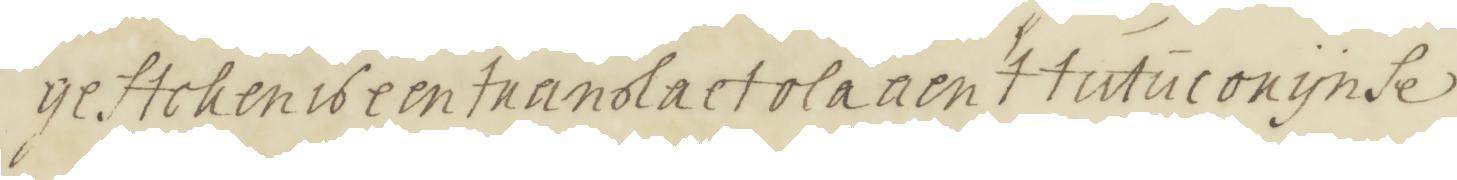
gestoken is een translaet ola aen ’t tutucorijnse
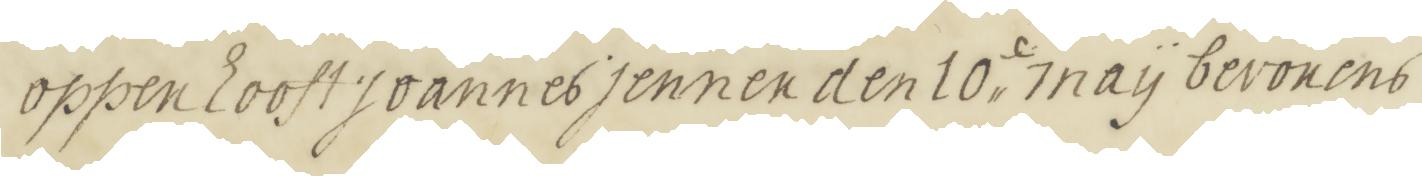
opper hooft joannes jenner den 10„e maij bevorens
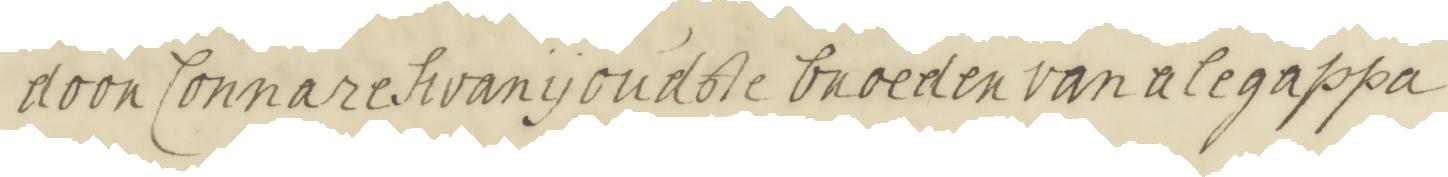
door Connareswanij oudste broeder van alegappa
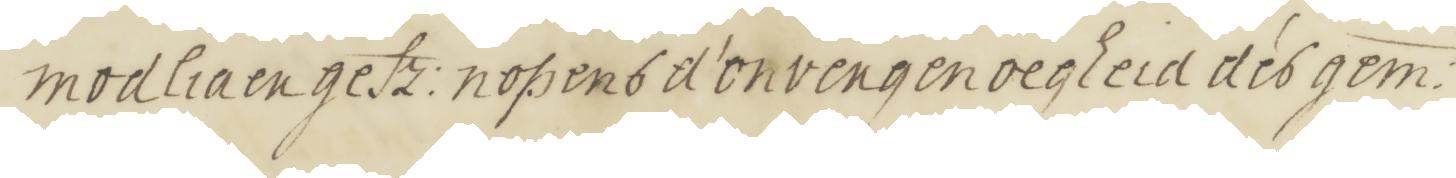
modliaer gesz: nopens d’onvergenoegheid des gem:
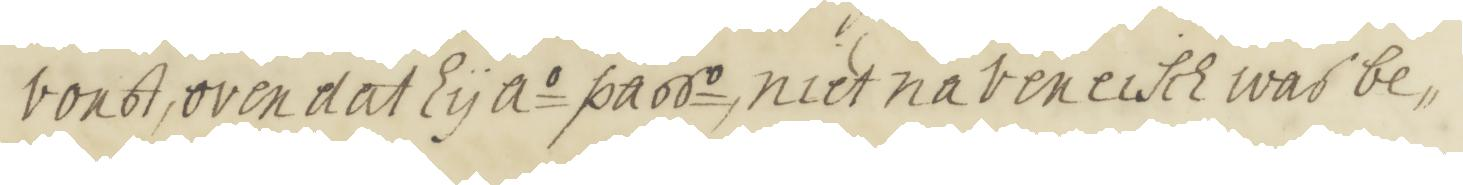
vorst, over dat hij a=o pass=o, niet na vereisch was be„
